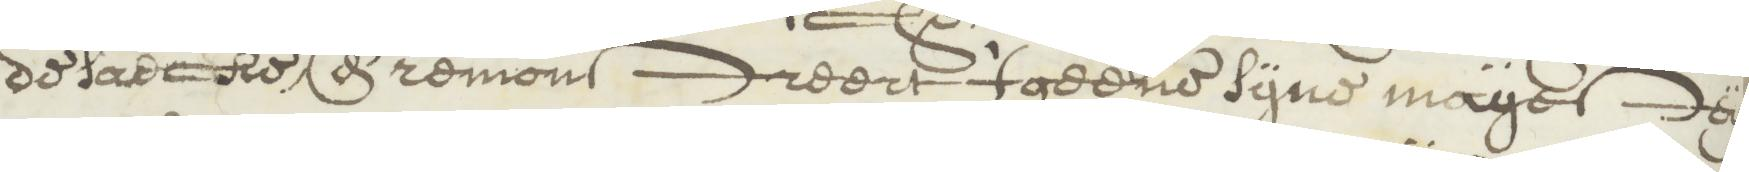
de saecke ende remonstreert ’tgeene sijne maijestij
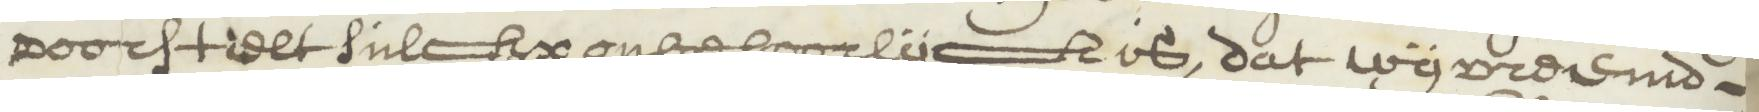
voorstelt sulckx onbehoorlijc is, dat wij vroemd-
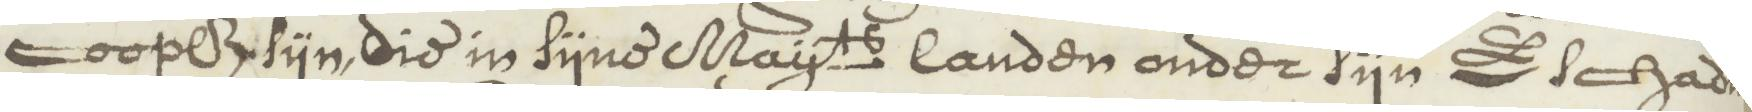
coopl sijn, die in sijne Maij=ts landen onder sijn S schad
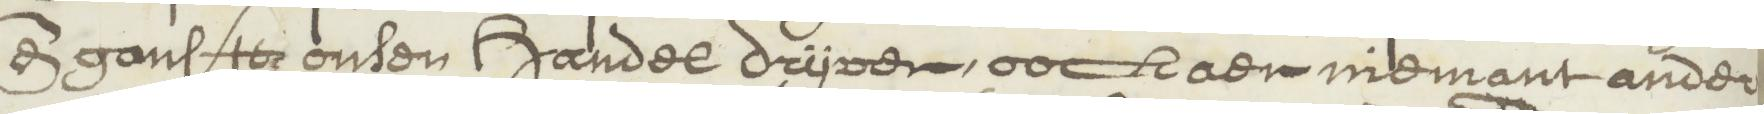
en gans ter onsen Handel drijven, oock aen niemant ander
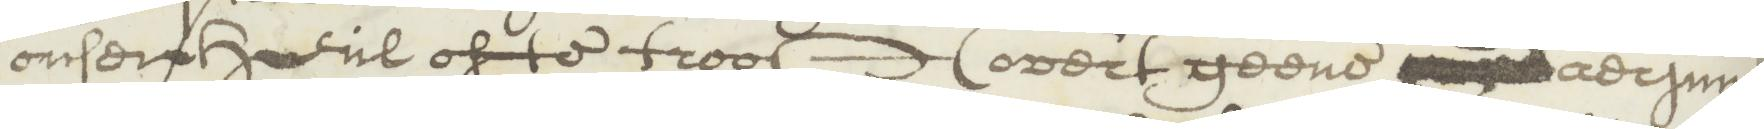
onsenheul of te troost (overt geene Daerjnne
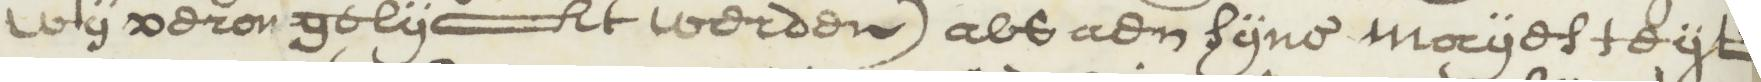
wij verongelijckt werden) als aen sijne majesteijt
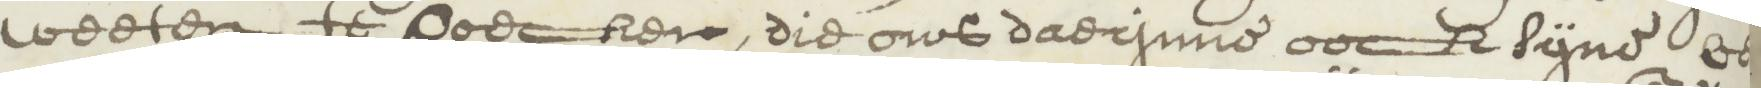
weeten te poecken, die ons daerjnne oock sijne be
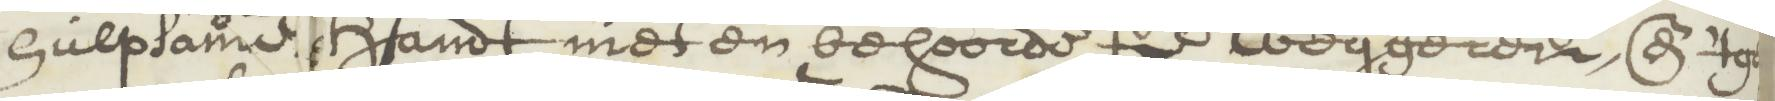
hulpsame handt niet en behoorde te weijgeren, en 'tg
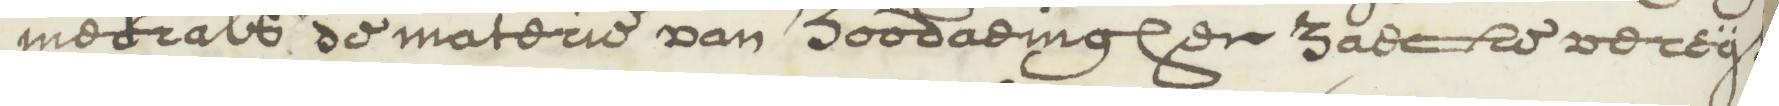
meerals de materie van Zoodaenighen zaecke vereij
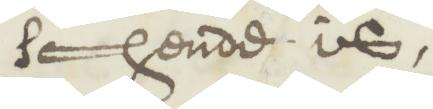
schende is,
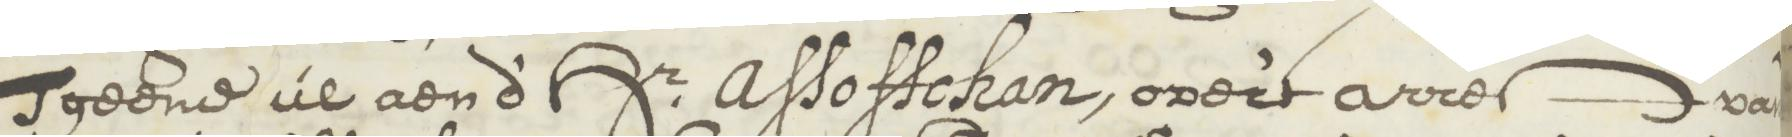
'Tgeene ul aen d'H,r assoffchan, over't arrest va
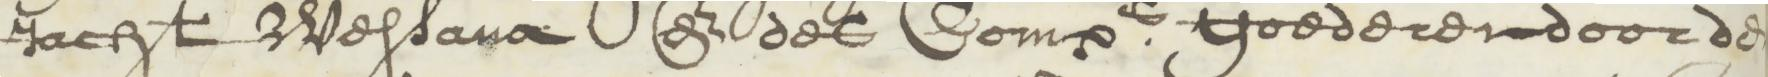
Jacht Wessana en des Comp.s Goederen door de
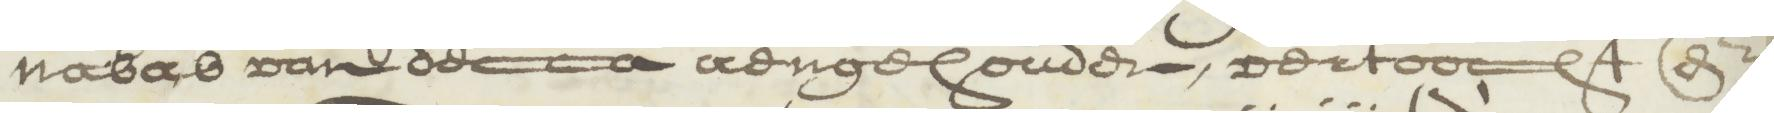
nabab van decca aengehouden, vertoocht en
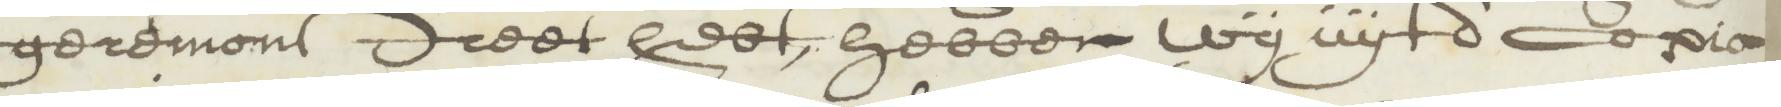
geremonstreet hebt, hebben wij uijt d' copia
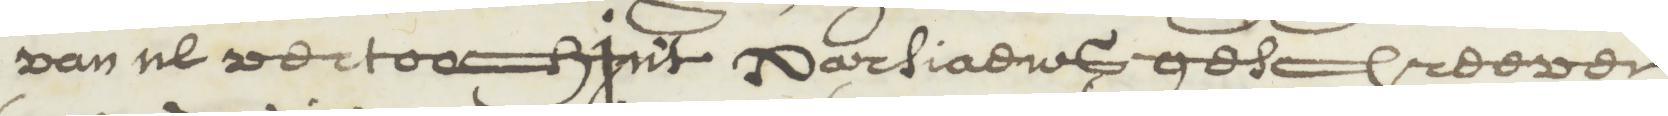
van ue vertoochjut parsiaens geschreeven
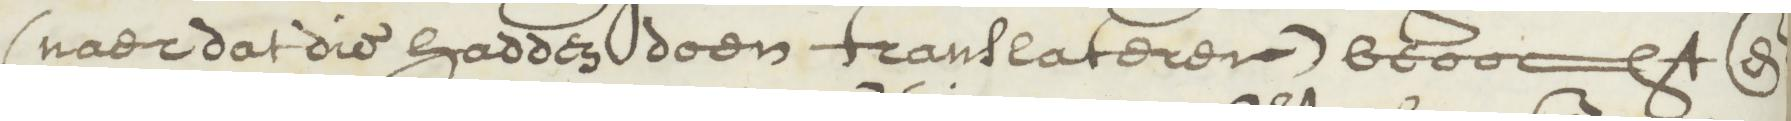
naer dat die hadden doen translateren) beoocht ende
